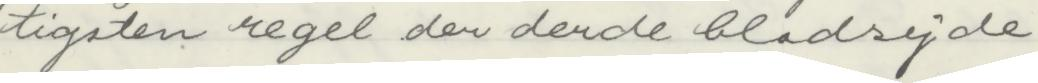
tigsten regel der derde bladzijde
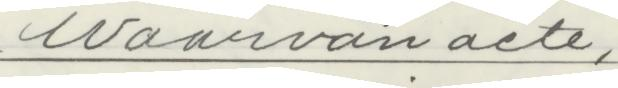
Waarvan acte,
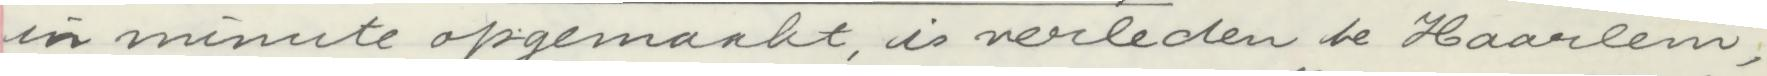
in minute opgemaakt, is verleden te Haarlem,
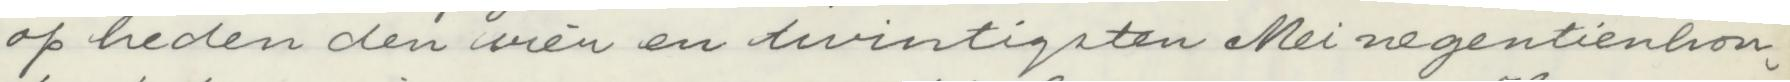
op heden den vier en twintigsten Mei negentienhon-
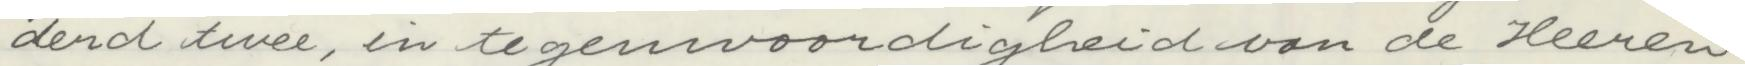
derd twee, in tegenwoordigheid van de Heeren
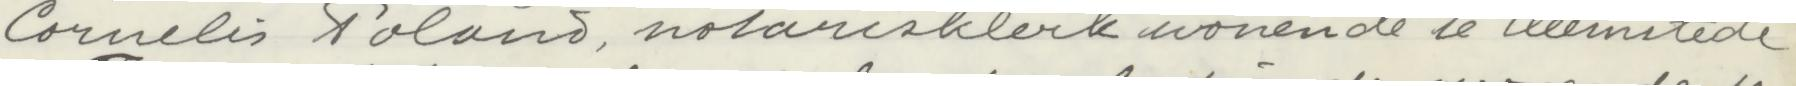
Cornelis Poland, notarisklerk wonende te Heemstede
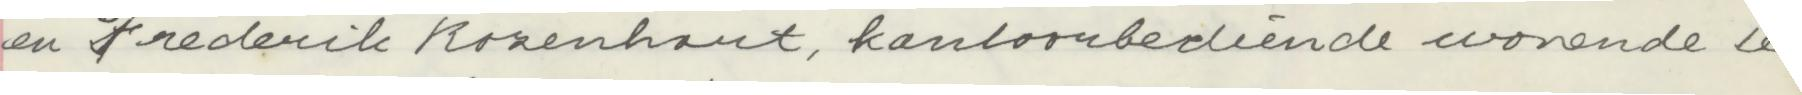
en Frederik Rozenhout, kantoorbediende wonende te
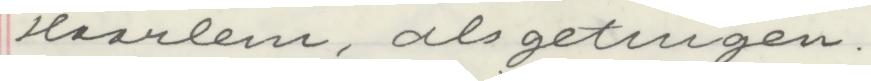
Haarlem, als getuigen.
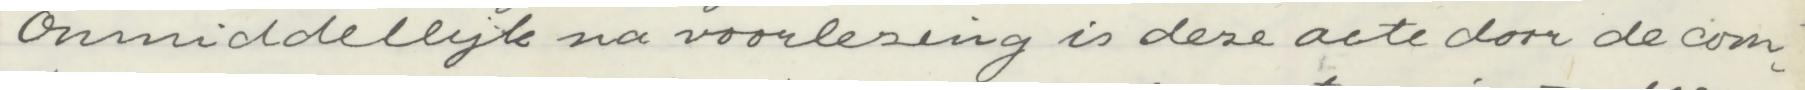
onmiddellijk na voorlezing is deze acte door de com-
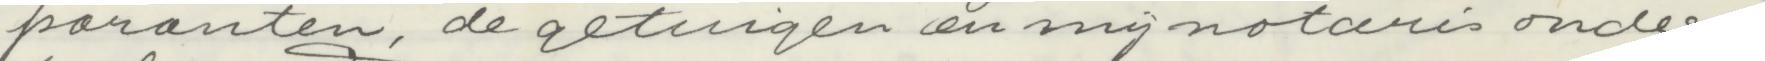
paranten, de getuigen en mij notaris onder
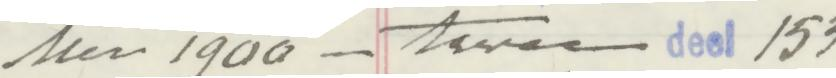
sten 1900 — twee
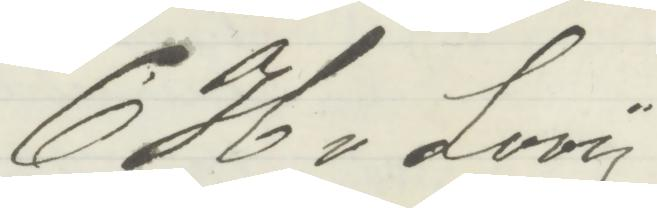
C H v Looij
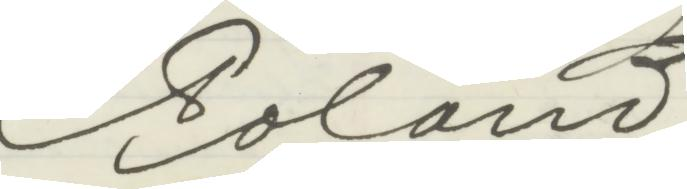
Poland
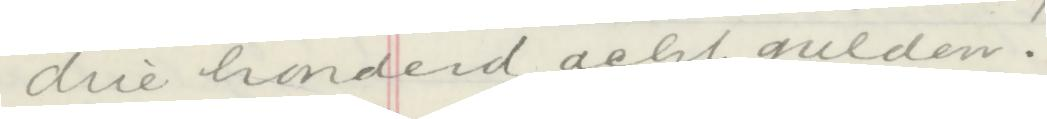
drie honderd acht gulden.
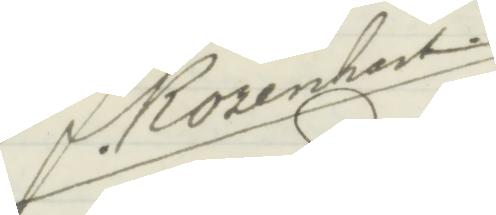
J. Rozenhout
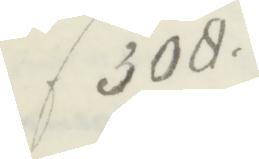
ƒ308.
